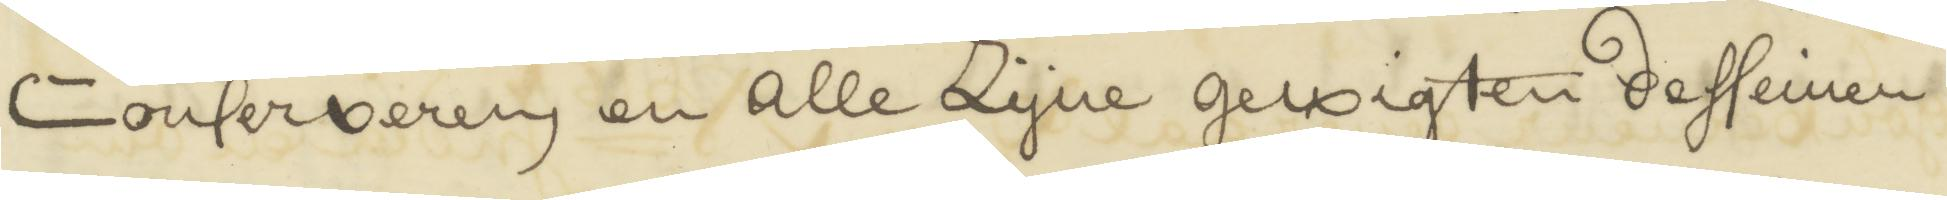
Conserveren en alle zijne gewigten desseinen
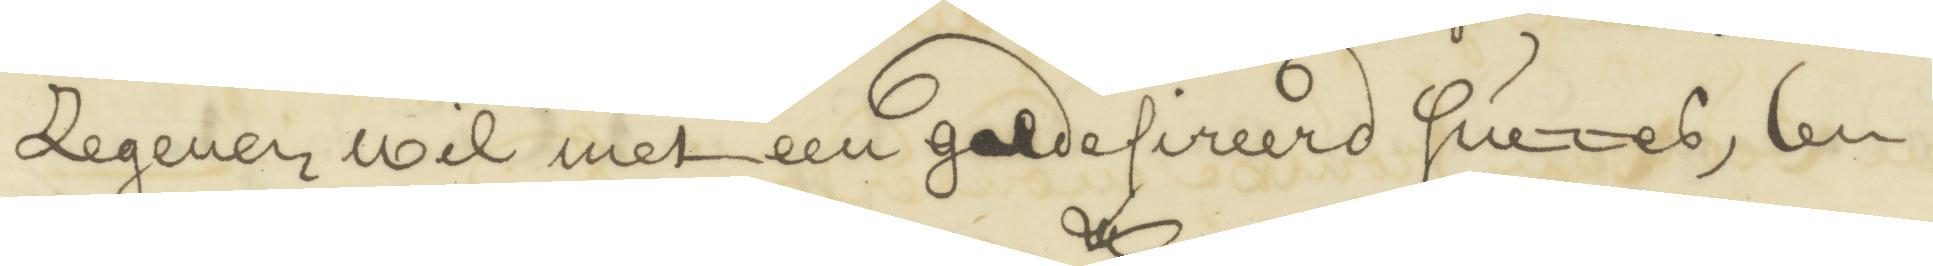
zegenen wil met een gedefireerd succes, ten
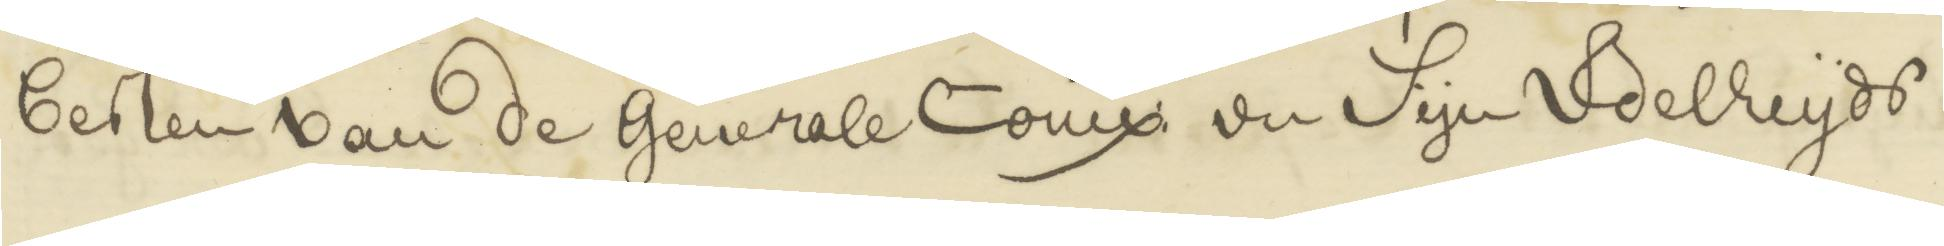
besten van de generale Comp: en Sijn Edelheijds
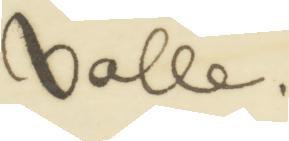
valle
